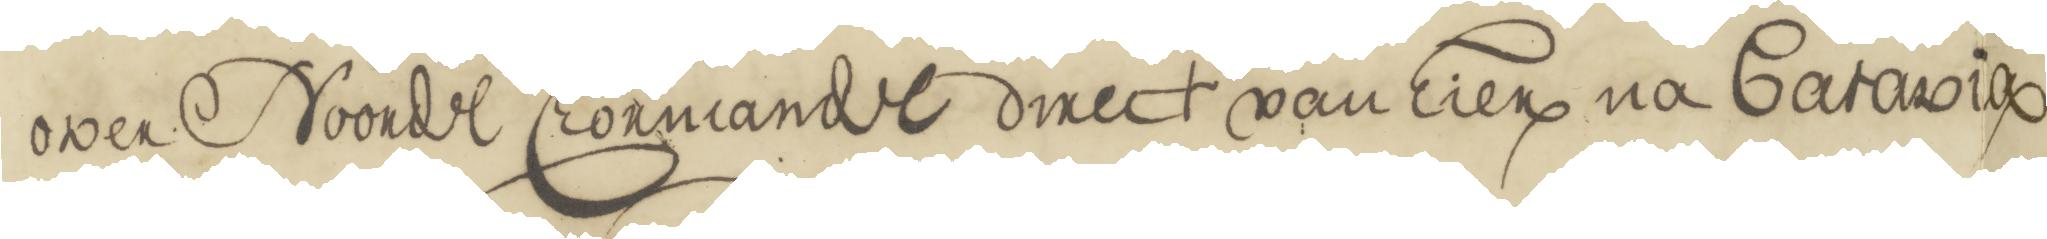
over Noordel Cormandel direct van hier na batavia
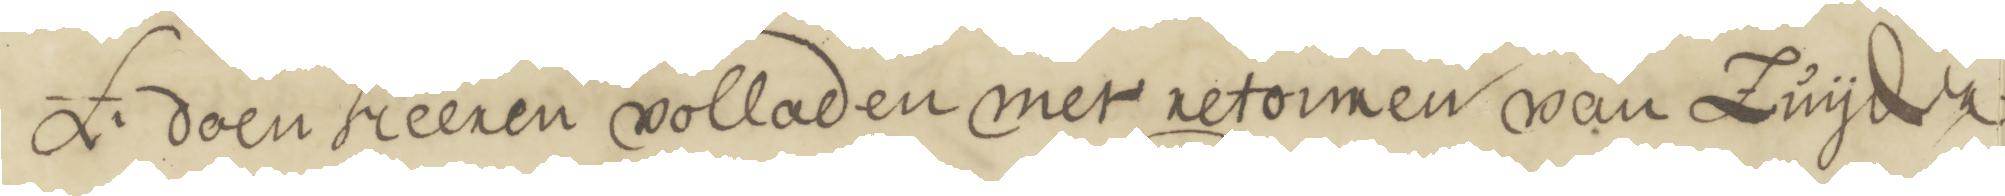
te doen keeren volladen met retouren van Zuijder
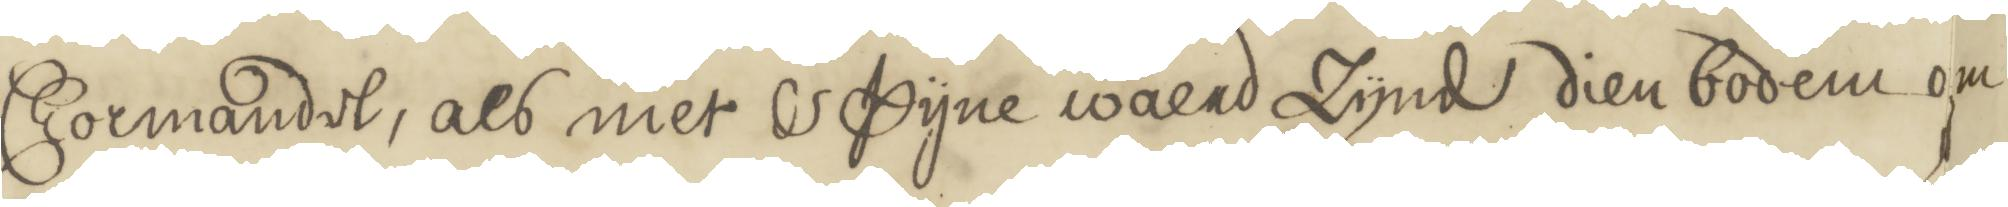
Chormandel, als niet de pijne waerd Zijnde dien bodem om
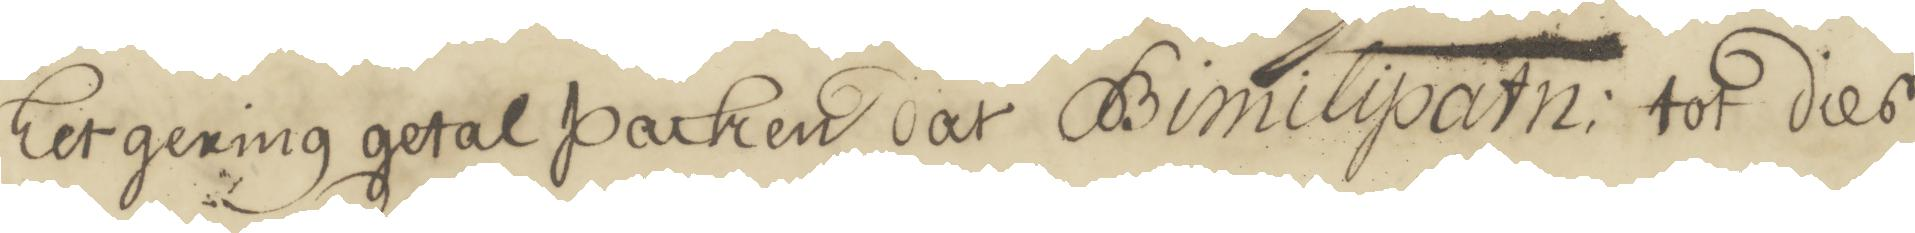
het gering getal packen dat Bimilipatn: tot dies
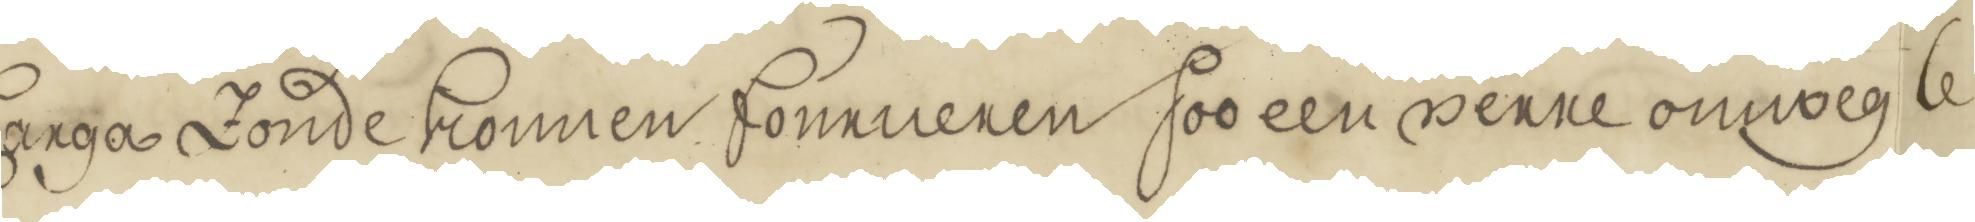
Carga Zoude konnen fourneren soo een verre omweg te
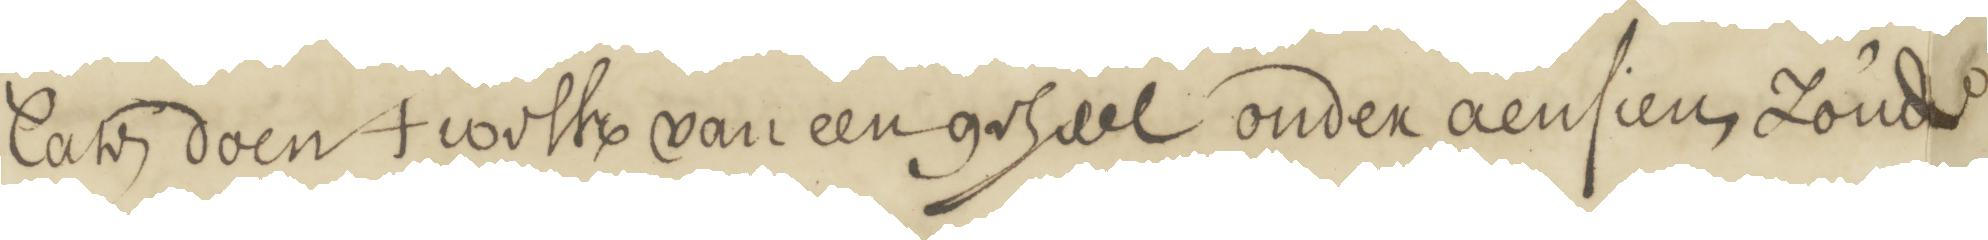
laten doen t welk van een geheel onder aensien Zoude
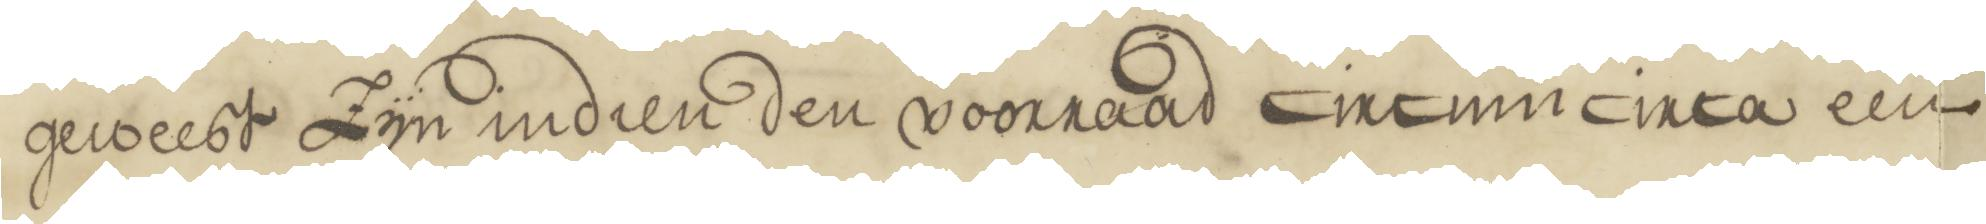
geweest Zijn indien den voorraad circum circa een
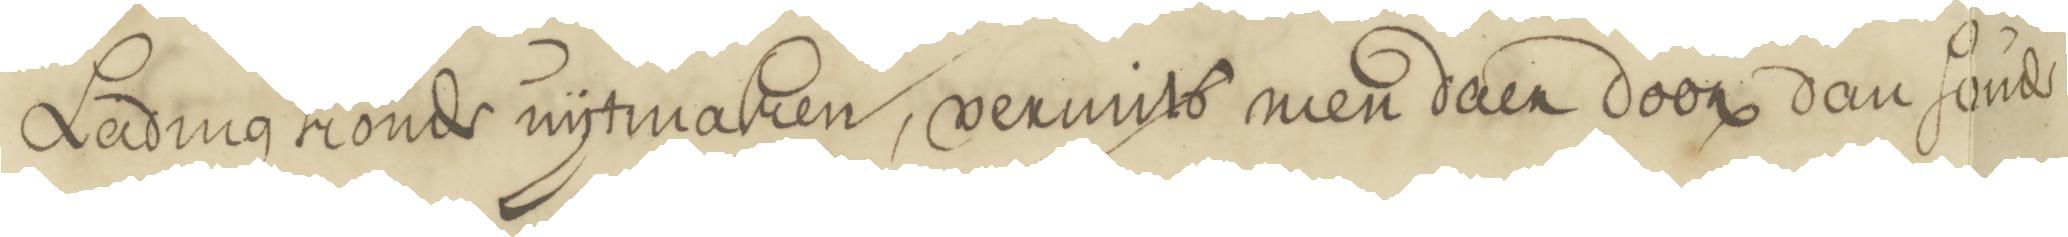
Lading konde uijtmaken, vermits men daer door dan soude
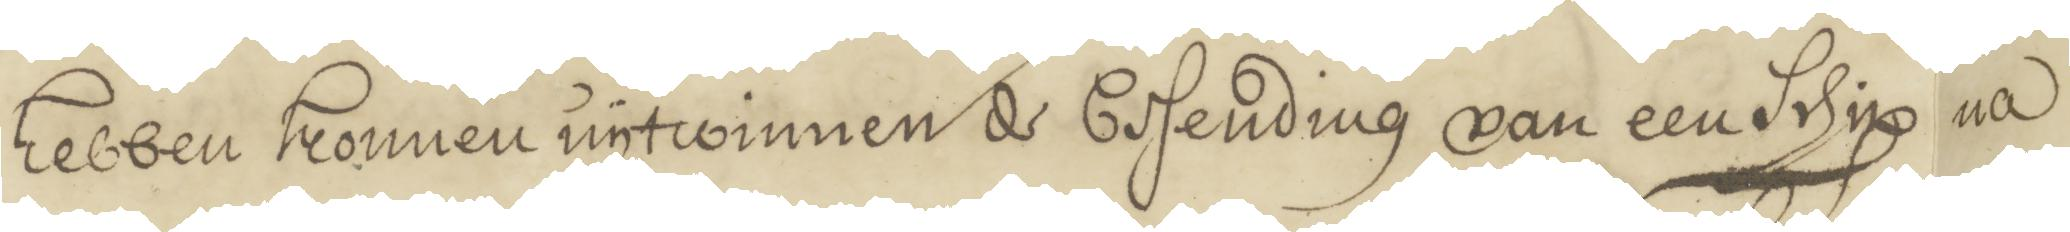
hebben konnen uijtwinnen de besending van een Schip na
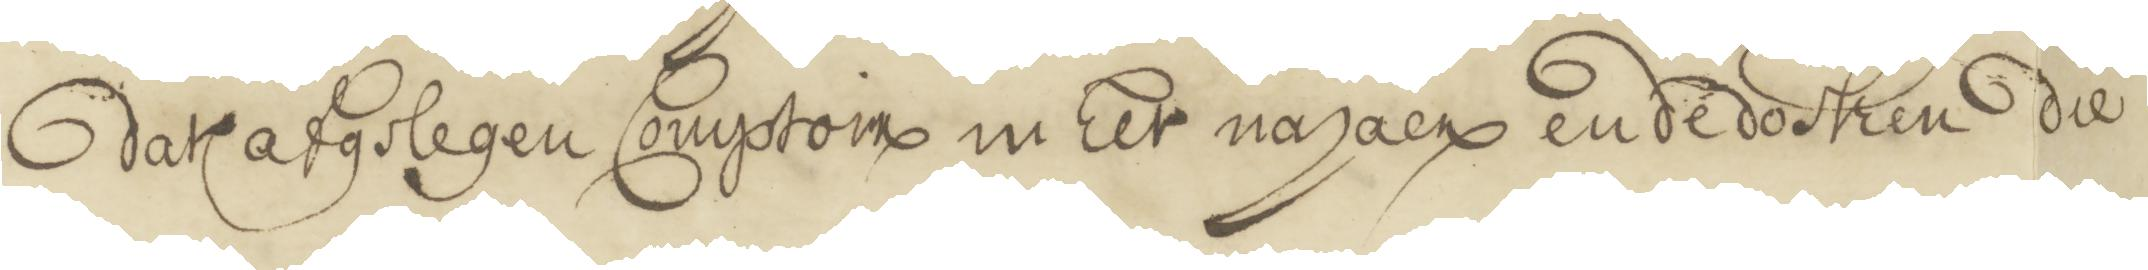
dat afgelegen Comptoir in het najaer en de doeken die
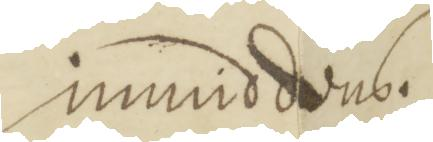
inmiddens.
